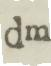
dm
